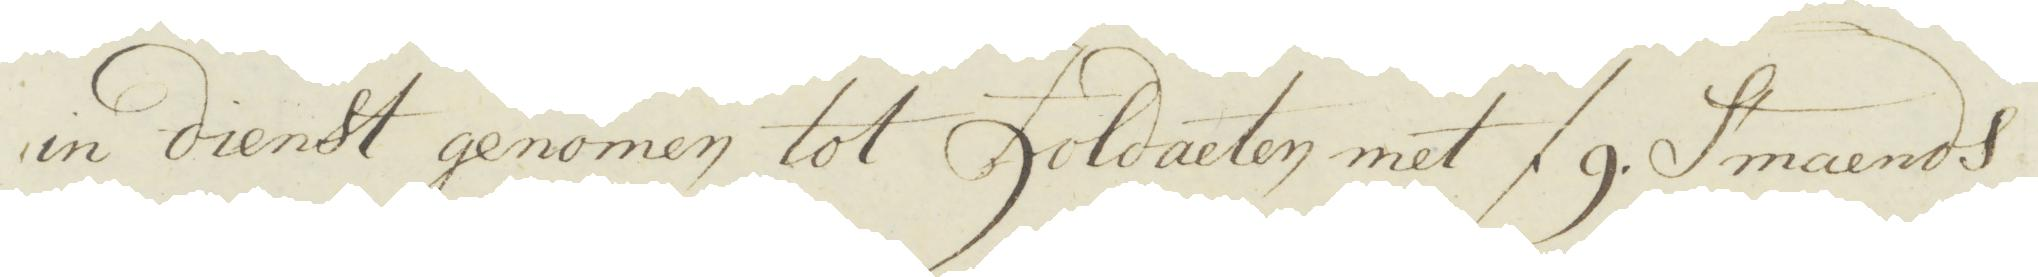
in dienst genomen tot Zoldaeten met ƒ 9. S'maends
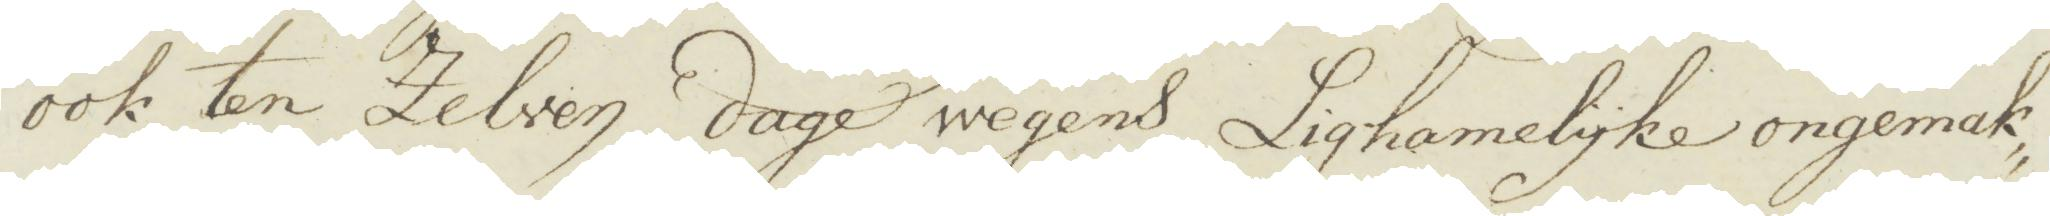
ook ten zelven dage wegens Lighamelijke ongemak„
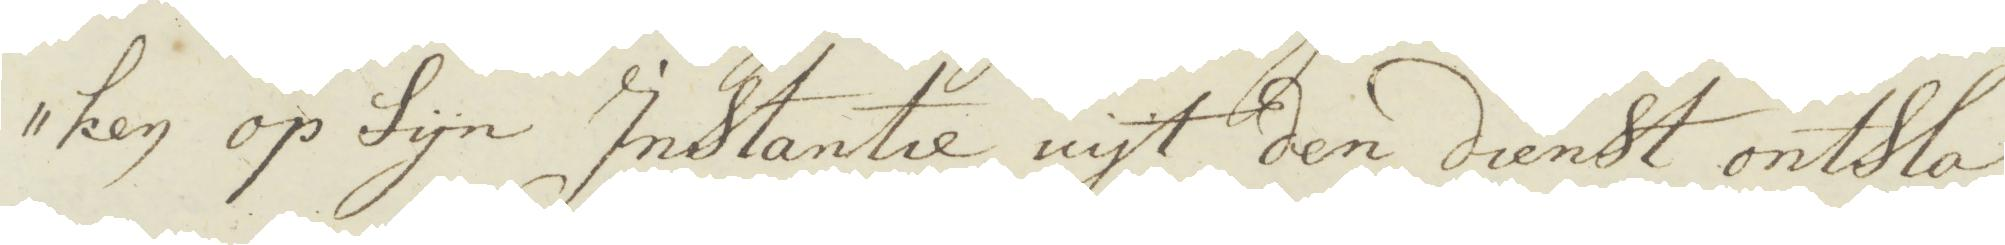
„ken op sijn Jnstantie uijt den dienst ontsla
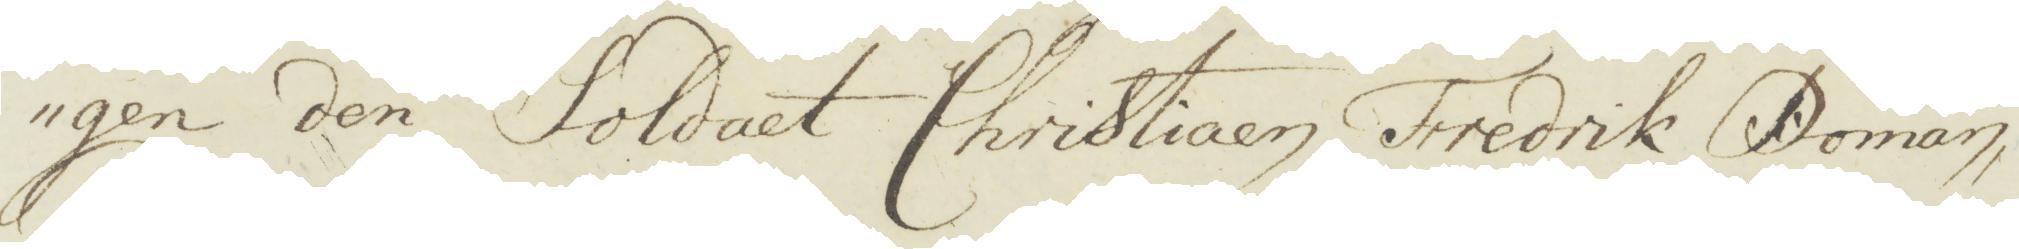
„gen den soldaet Christiaen Fredrik Doman,
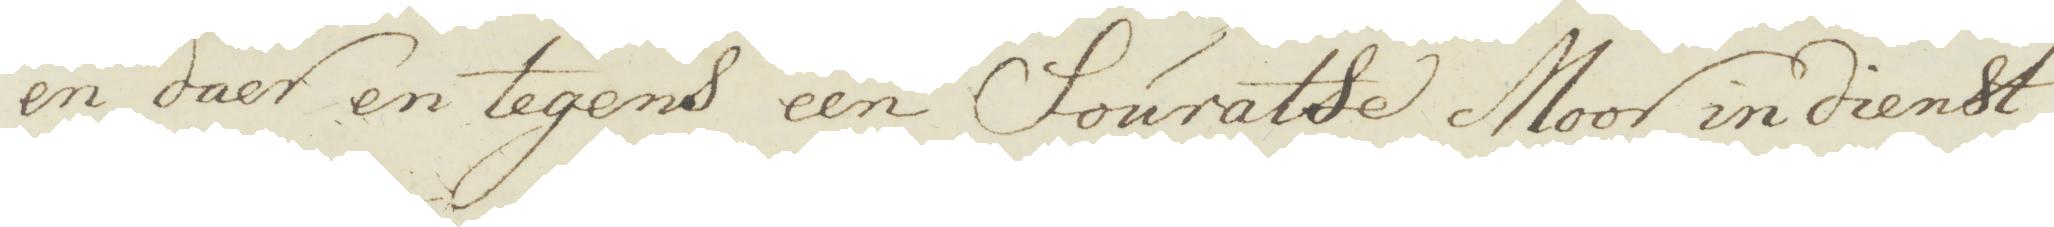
en daer en tegens een souratse Moor in dienst
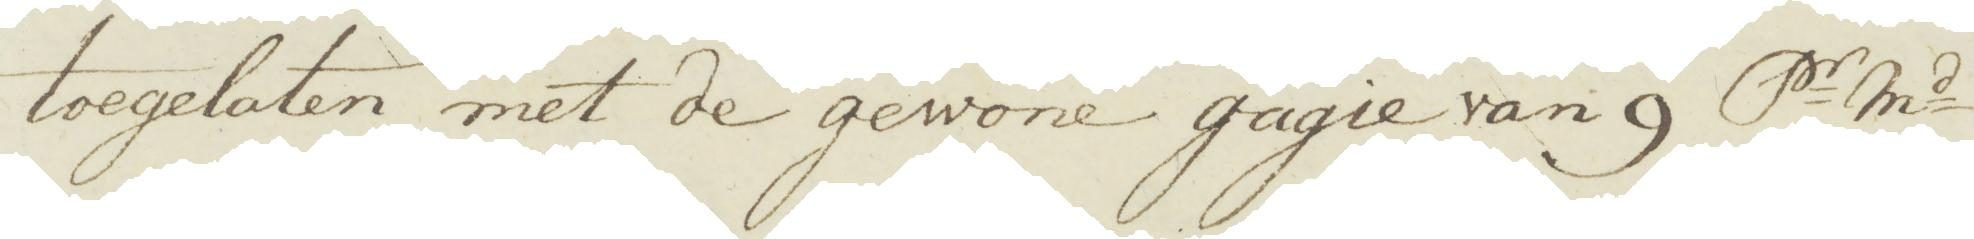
toegelaten met de gewone gagie van 9 P=r m=d
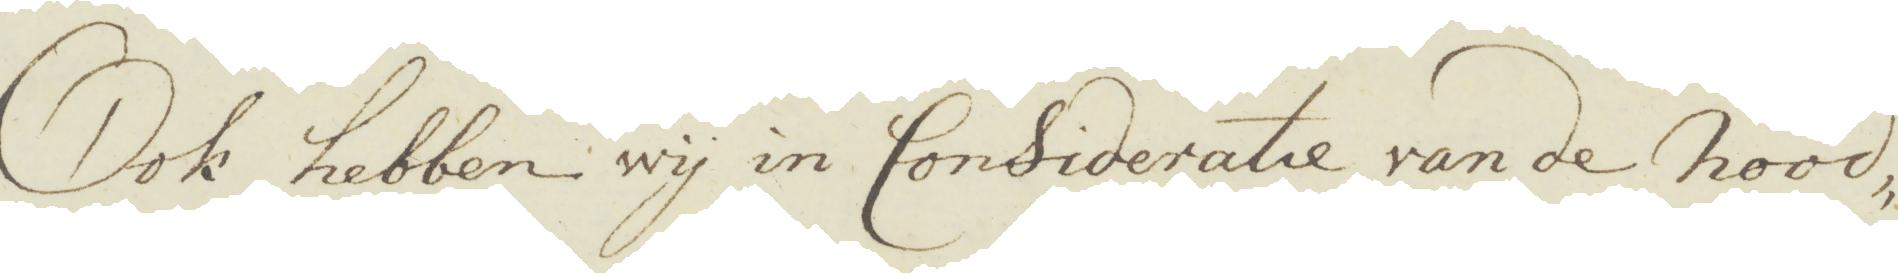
Ook hebben wij in Consideratie van de nood„
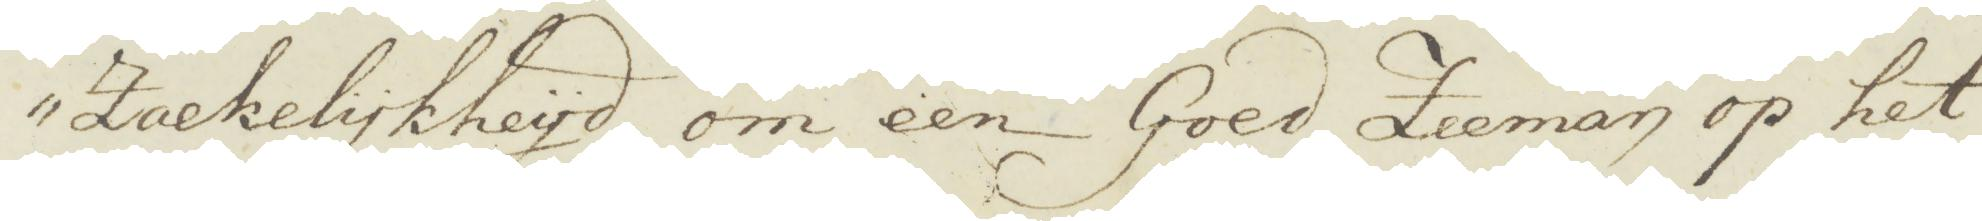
„zaekelijkheijd om een Goed Zeeman op het
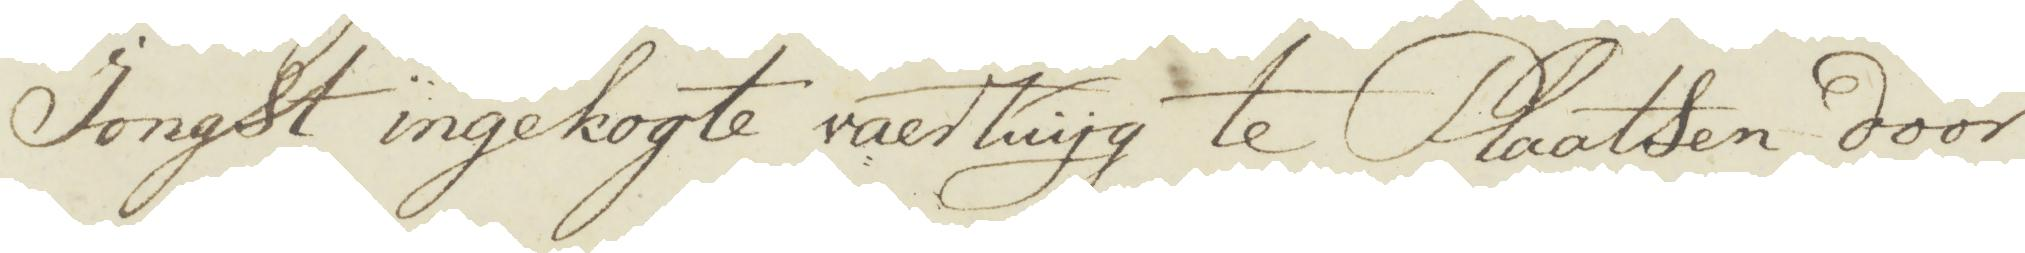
Iongst ingekogte vaertuijg te Plaatsen door
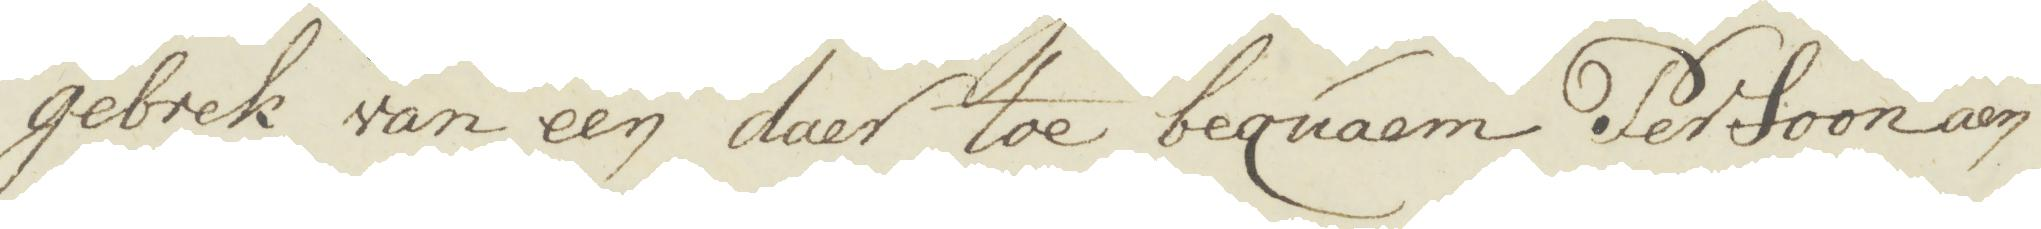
gebrek van een daer toe bequaem Persoon aen
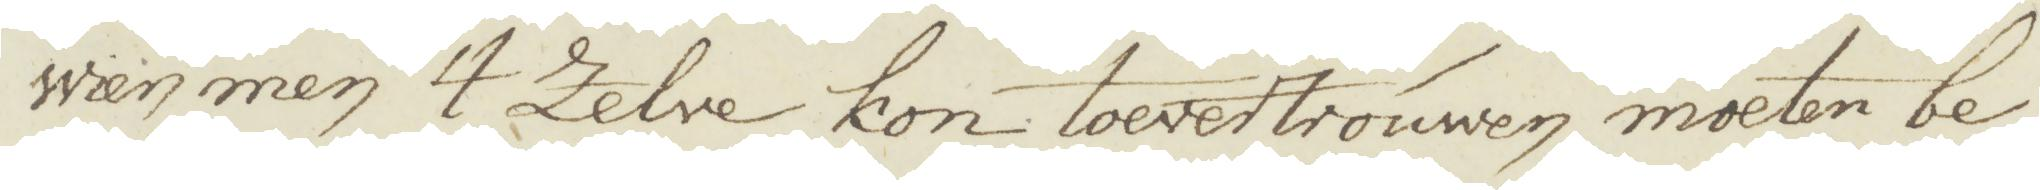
wien men ’t zelve kon toevertrouwen moeten be
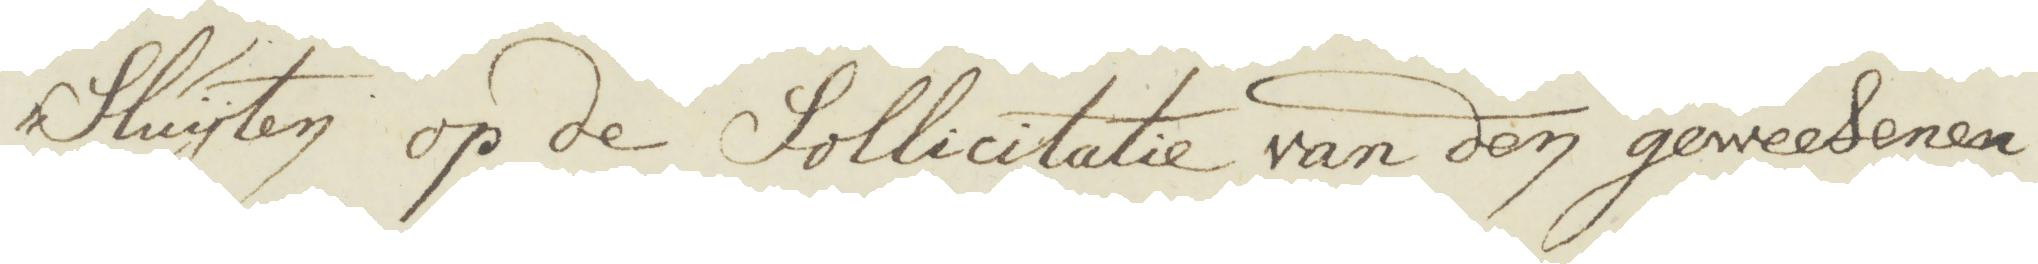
„sluijten op de sollicitatie van den geweesenen
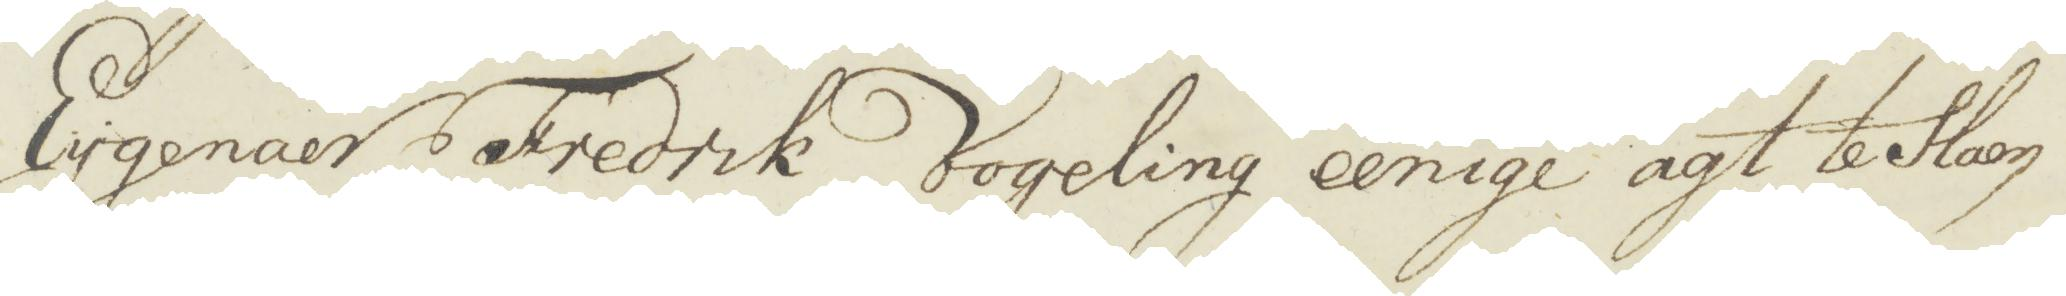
Eijenaer Fredrik Vogeling eenige agt te slaen
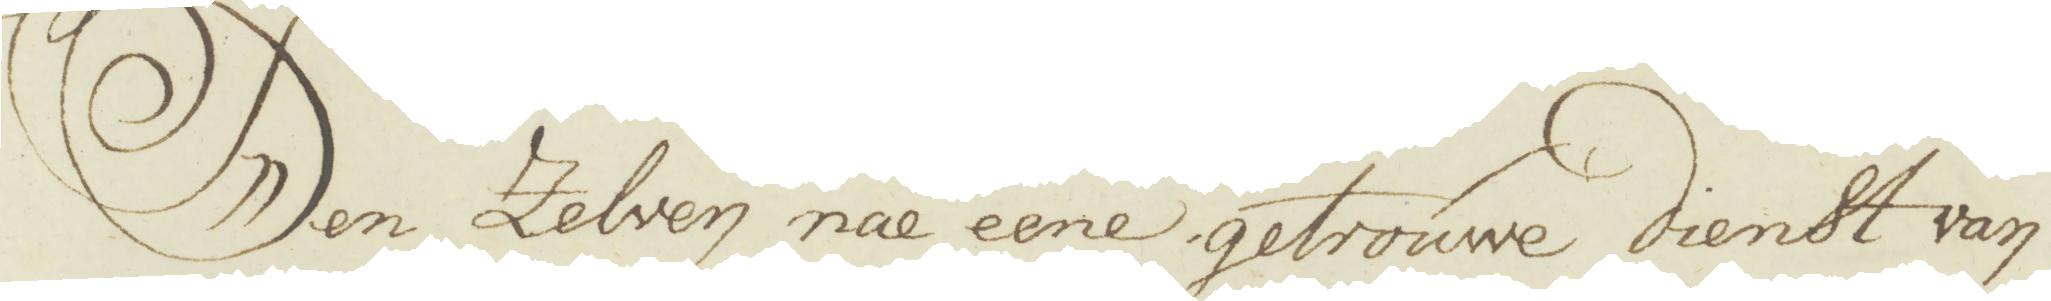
Den zelven nae eene getrouwe dienst van
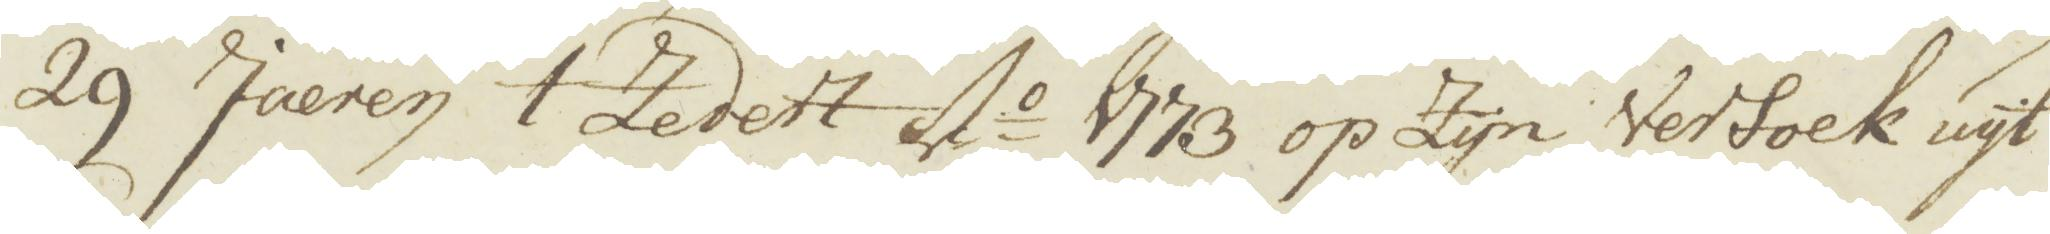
29 Jaeren ’t zedert A=o 1773 op zijn versoek uijt
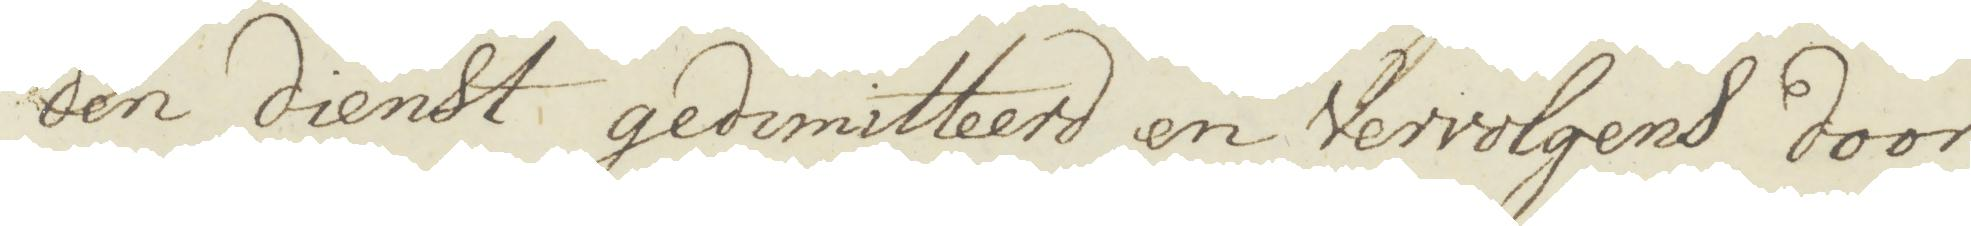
den dienst gedimitteerd en vervolgens door
